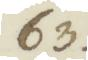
63.
